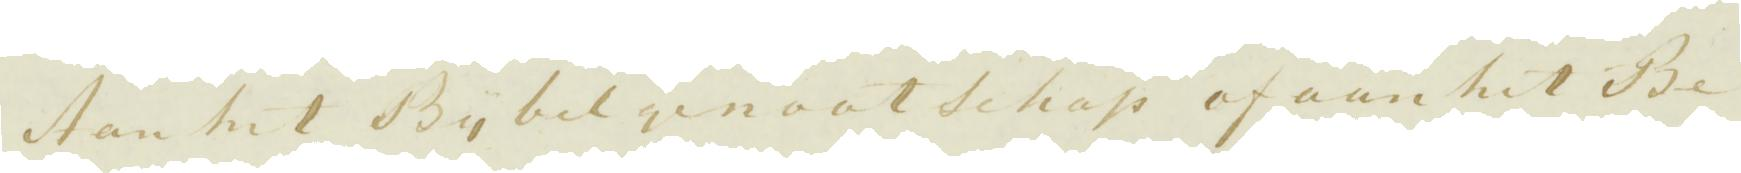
Aan het Bijbelgenootschap of aan het Be
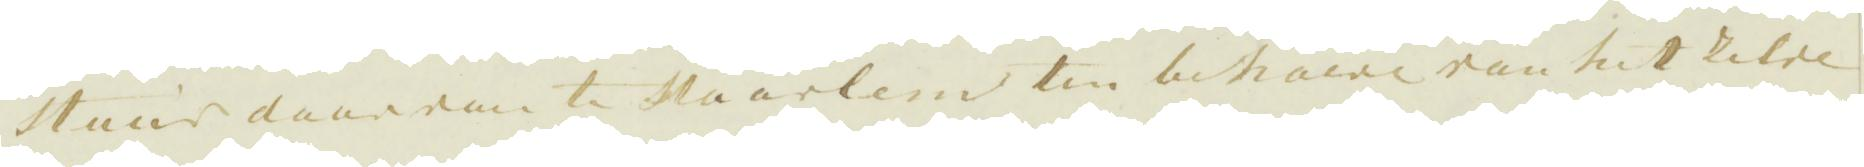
stuur daar van te Haarlem ten behoeve van het zelve
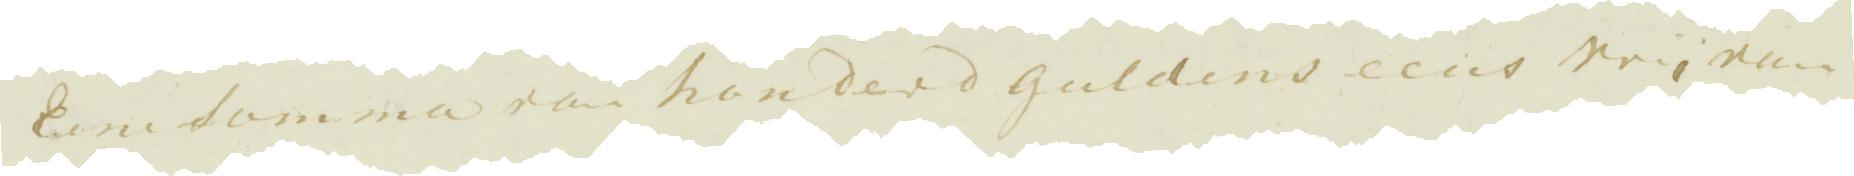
Eene somma van honderd guldens eens vrij van
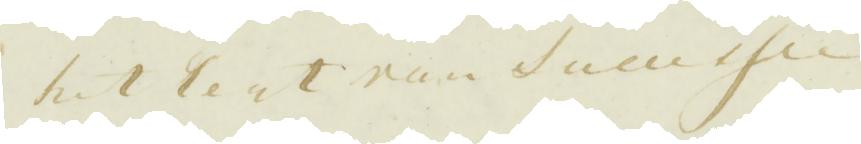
het regt van successie
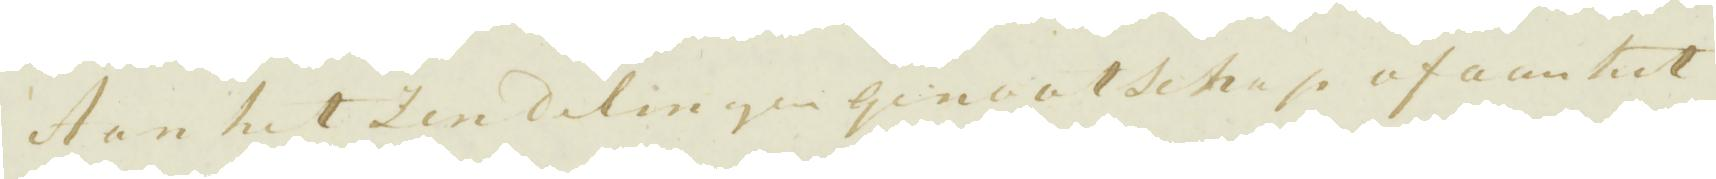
Aan het Zendelingen genootschap of aan het
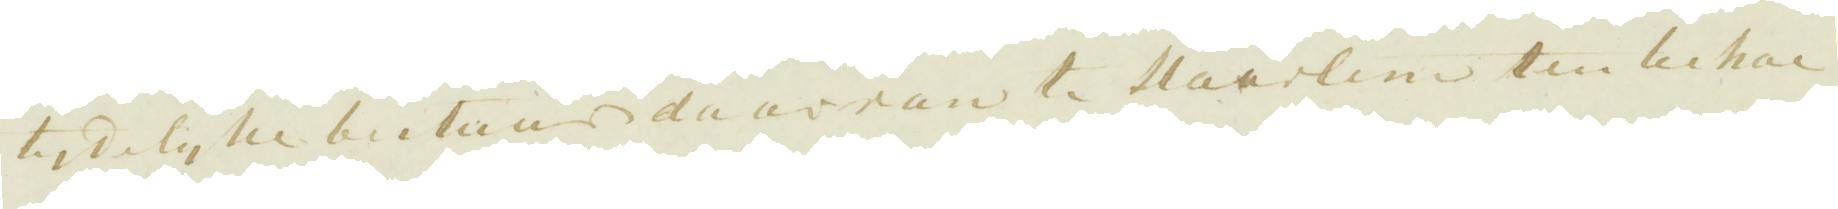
tydelijke bestuur daar van te Haarlem ten behoe
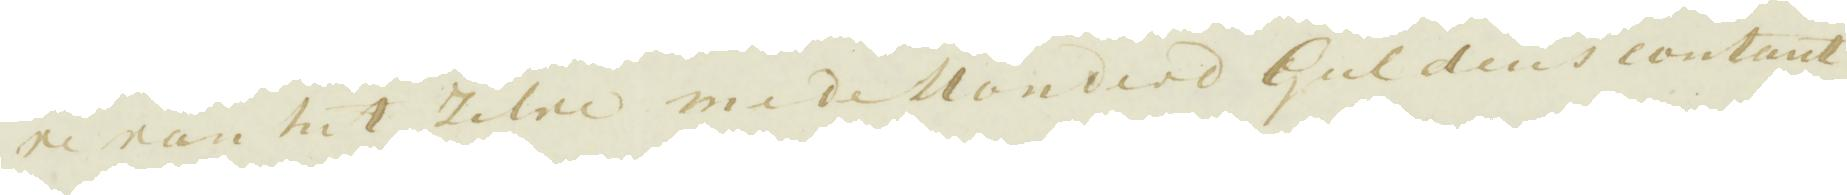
ve van het zelve mede Honderd Guldens contant
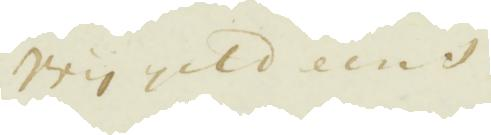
vrij geld eens
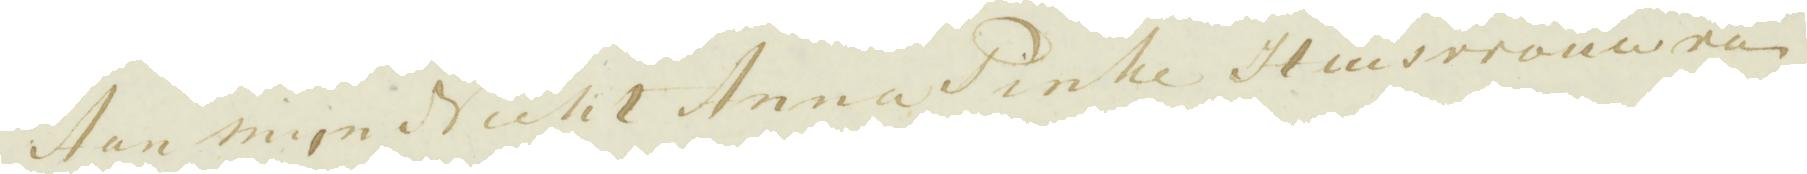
Aan mijn Nicht Anna Pinke Huisvrouw van
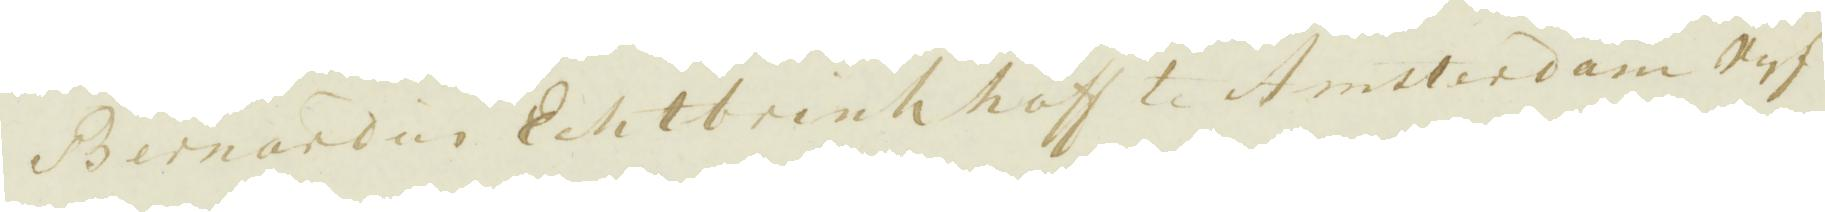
Bernardus Echtbrinkhoff te Amsterdam vyf
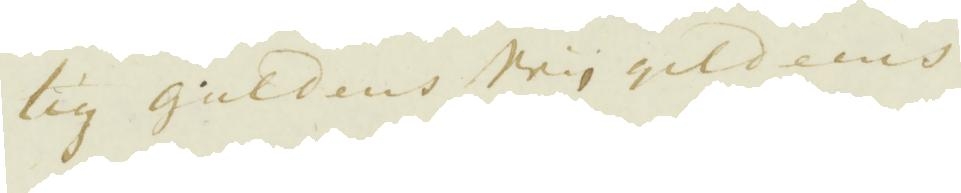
tig guldens vrij geld eens
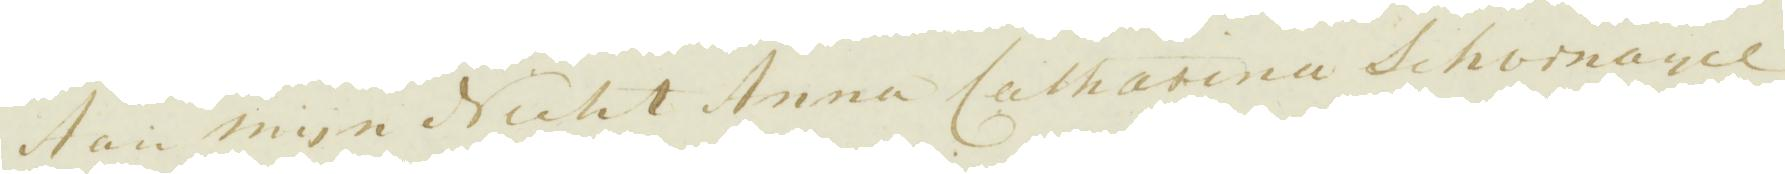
Aan mijn Nicht Anna Catharina Schornagel
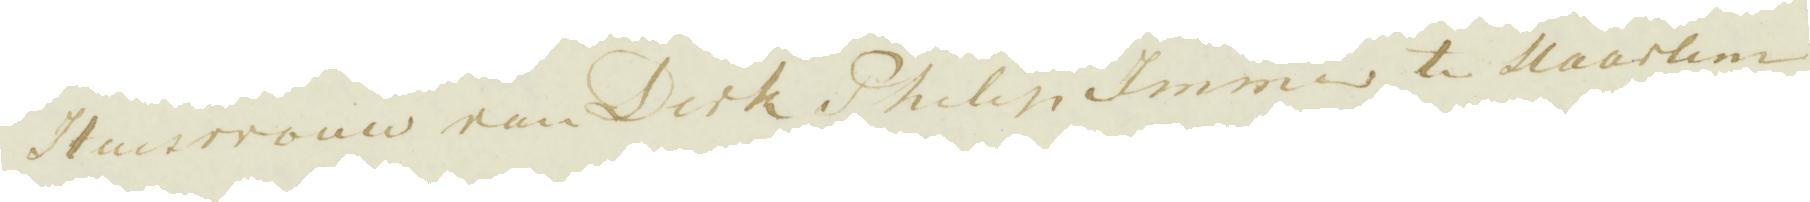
Huisvrouw van Dirk Philip Immer te Haarlem
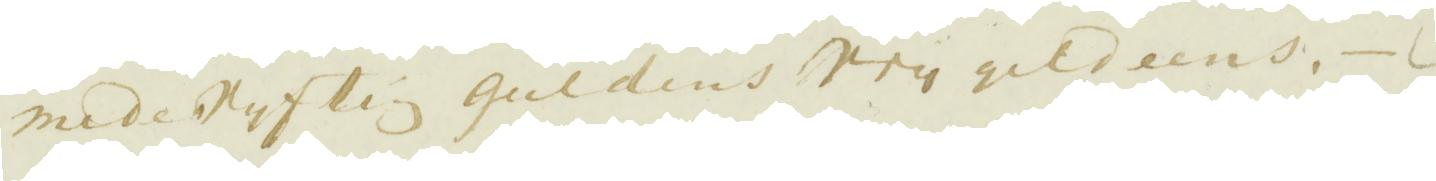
mede vyftig guldens vrij geld eens.—
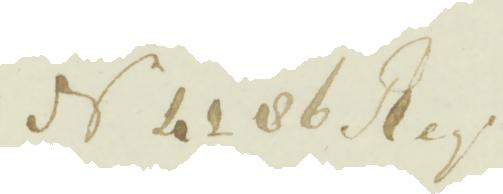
N 4186 Reg
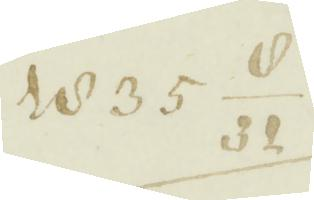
1835 8/32
